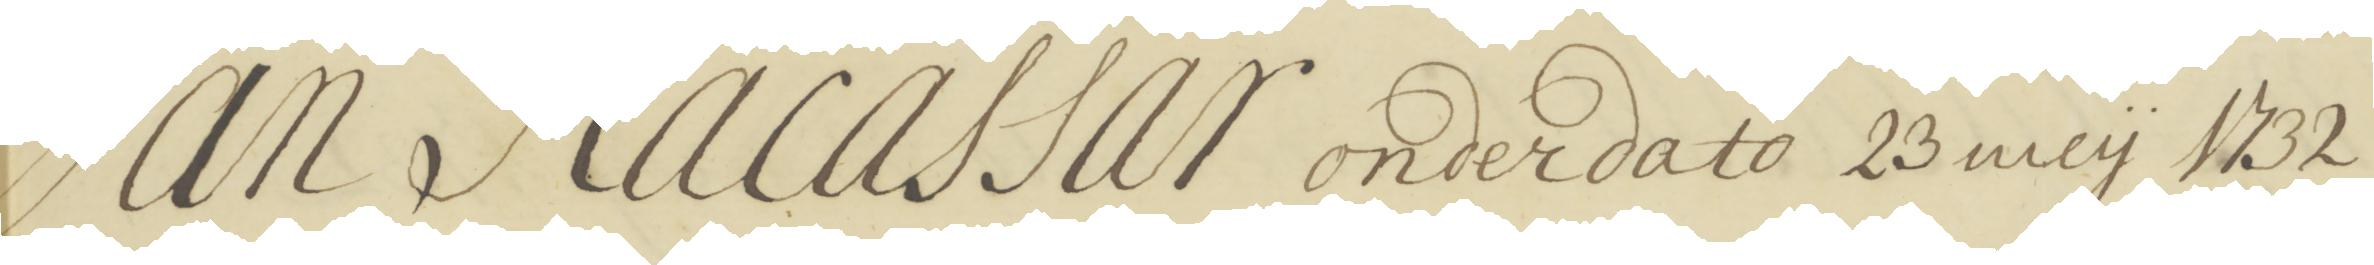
Van Macassar onder dato 23 meij 1732
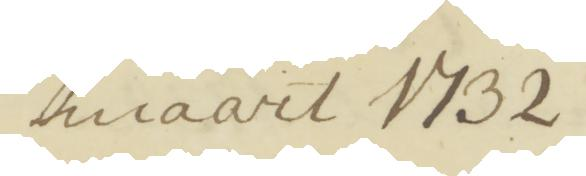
maart 1732
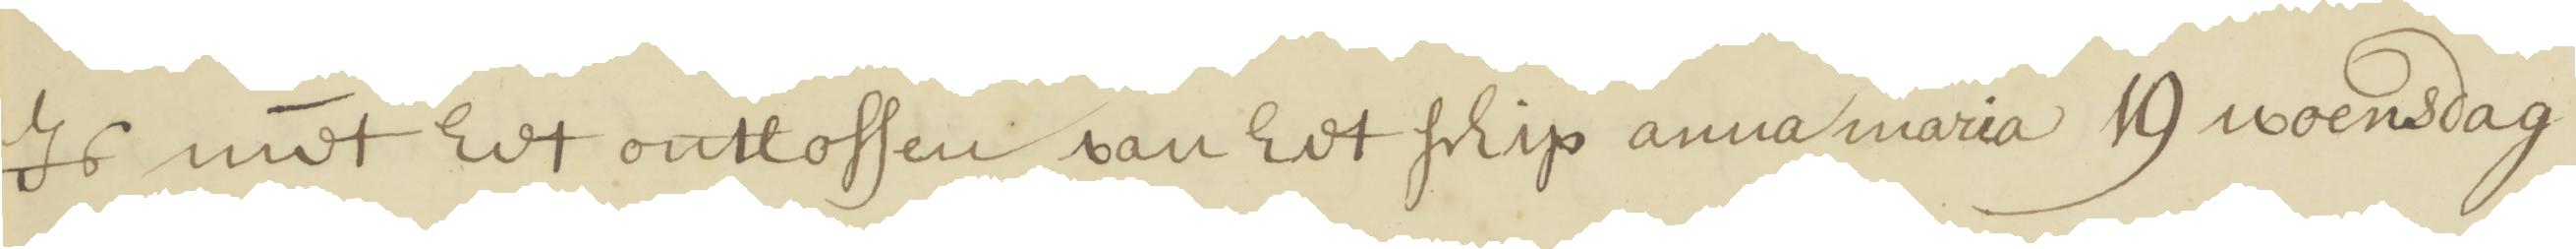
Js met het ontlossen van het schip anna maria 19 woensdag
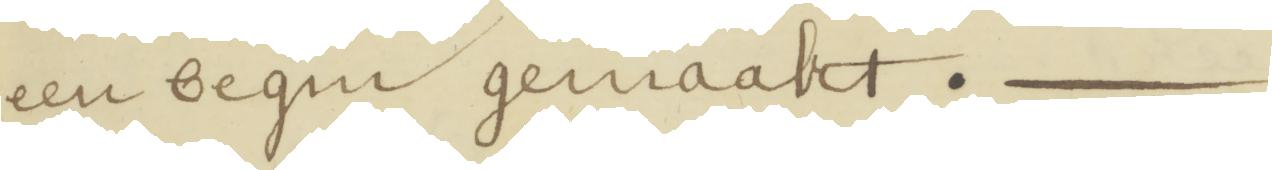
een begin gemaakt. —
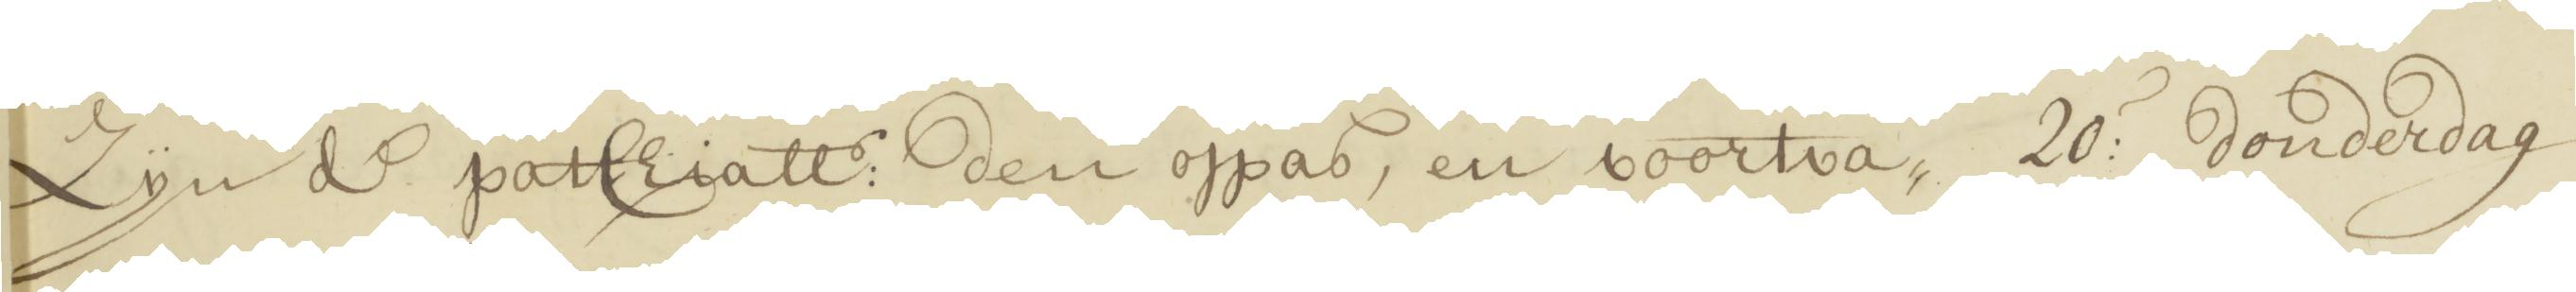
Zijn de patchiall:s den oppas, en voortva„ 20:' donderdag
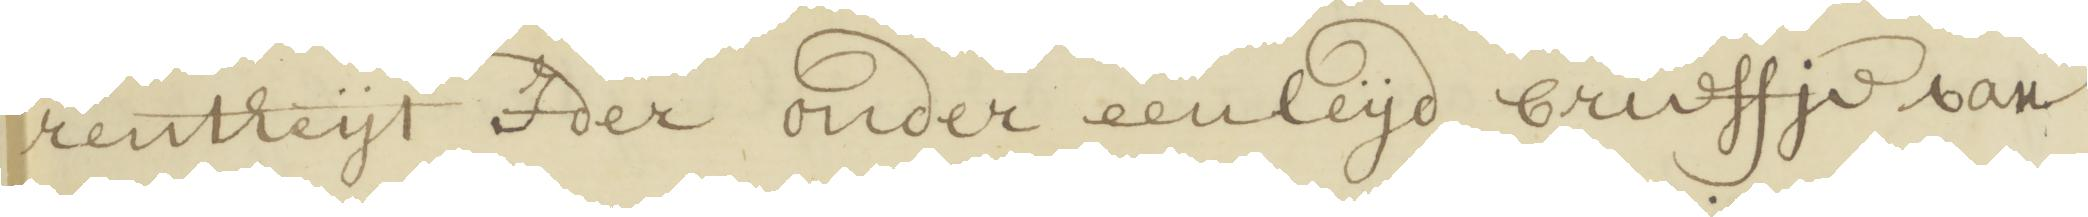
rentheijt Ider onder eenleijd brieffje van
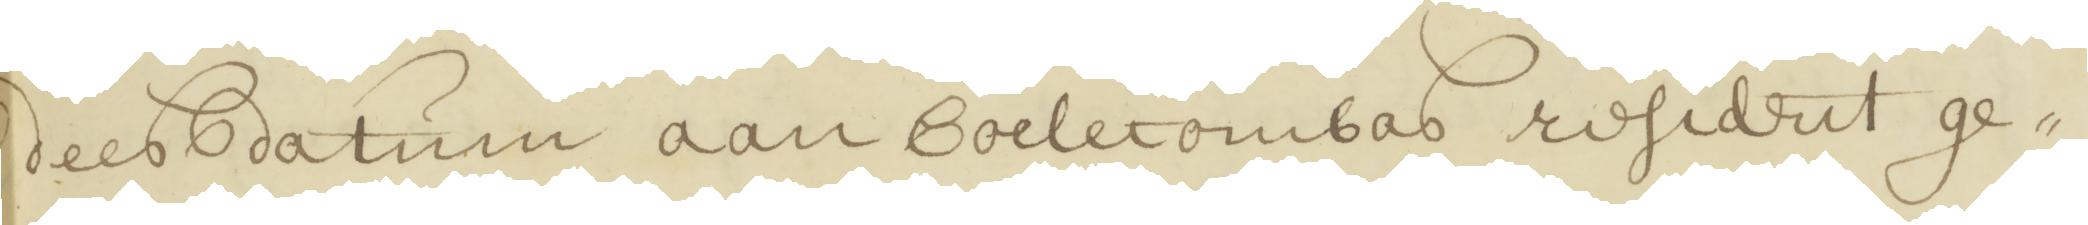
dees datum aan boelecombas resident ge„
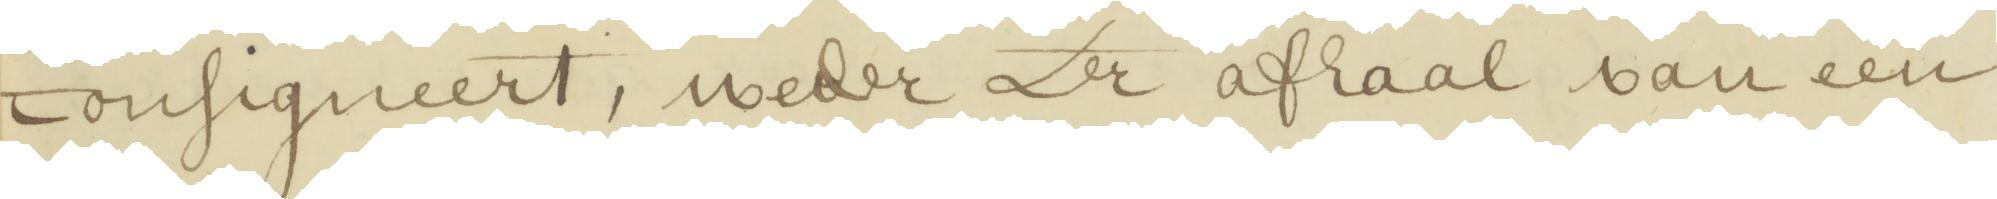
consigneert, weder ter afhaal van een
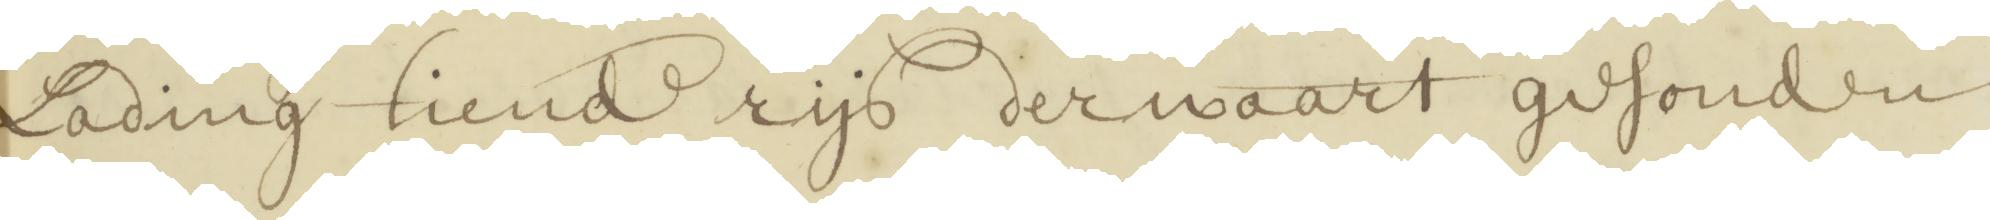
lading tiende rijs derwaart gesonden
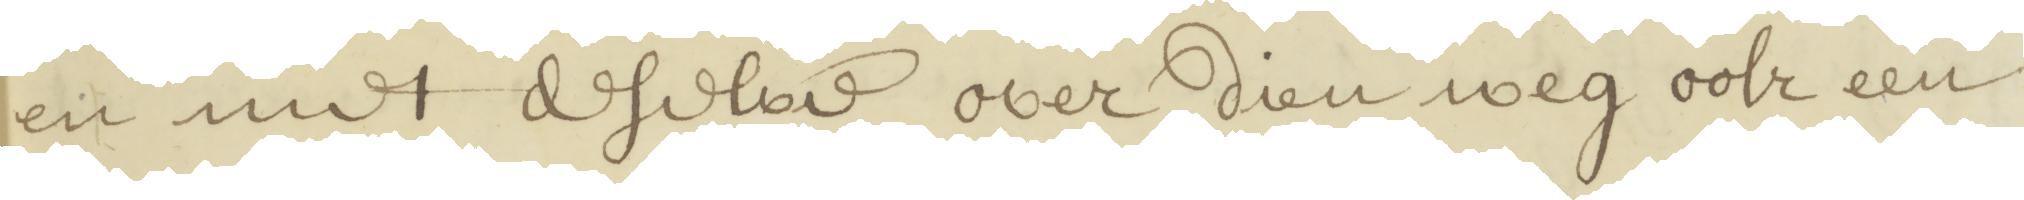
en met deselve over dien weg ook een
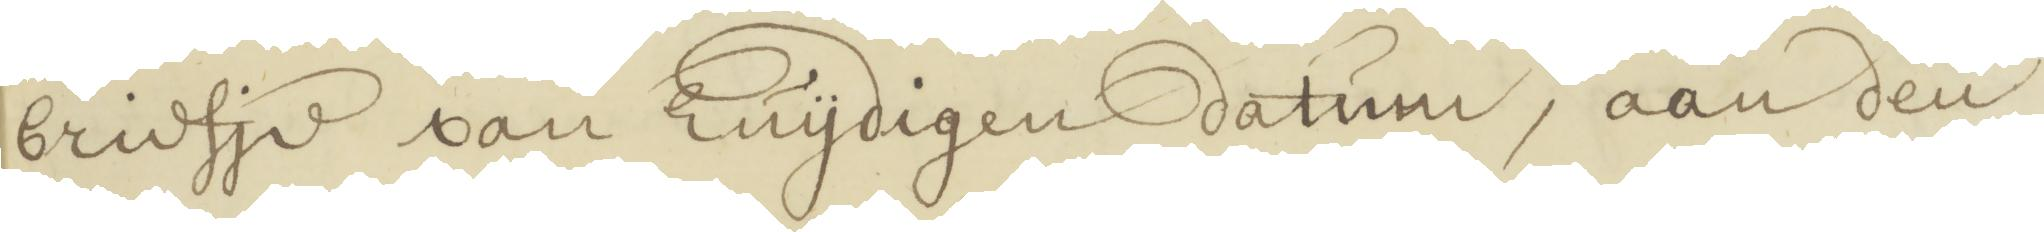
briefje van huijdigen datum, aan den
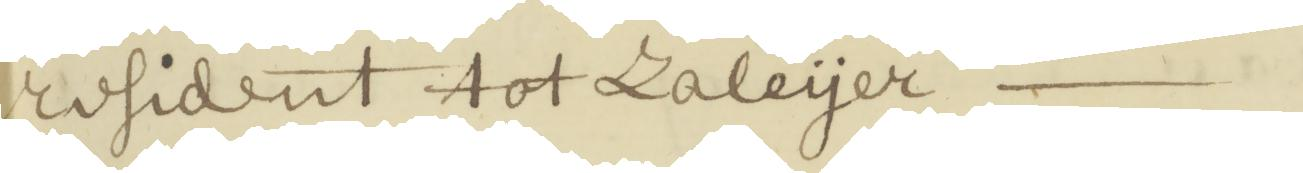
resident tot zaleijer —
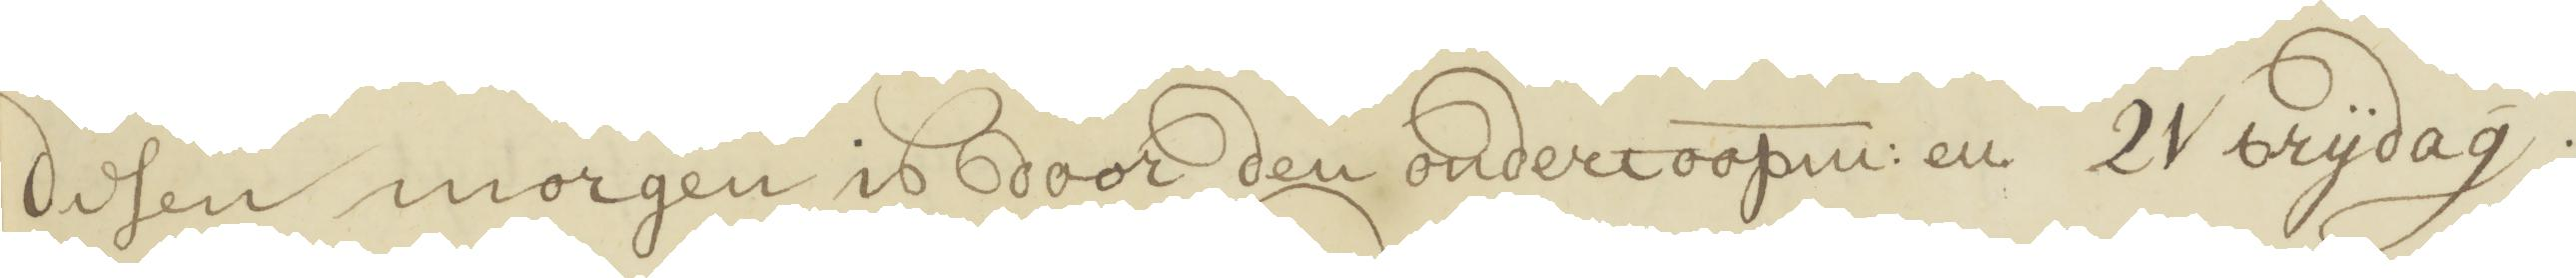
desen morgen is door den ondercoopm: en 21 vrijdag
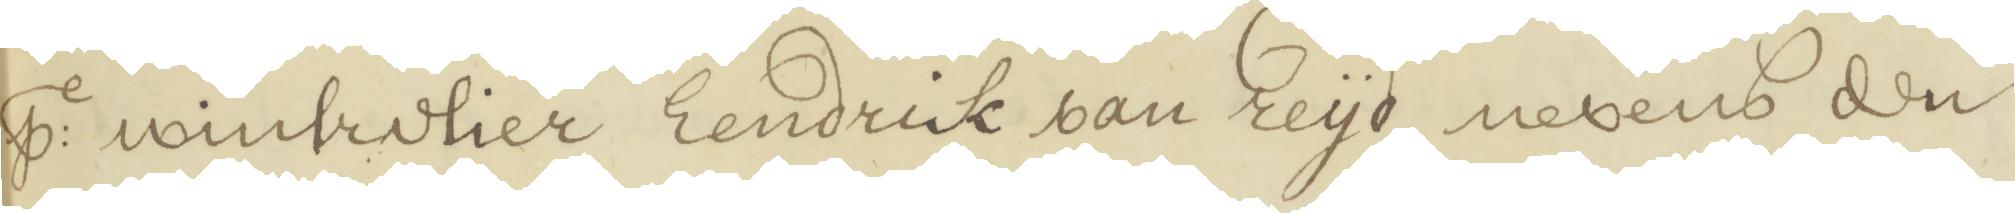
p:l winkelier hendrik van reijd nevens den
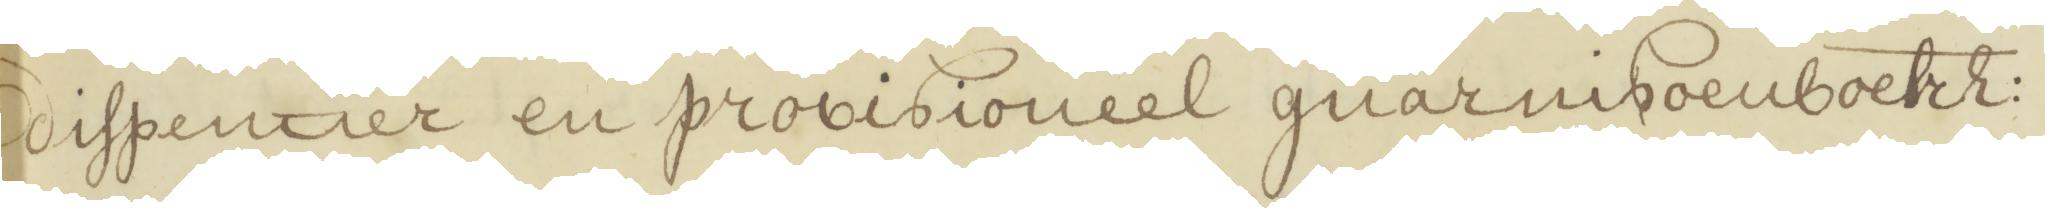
dispencier en provisioneel guarnisoenboekh:
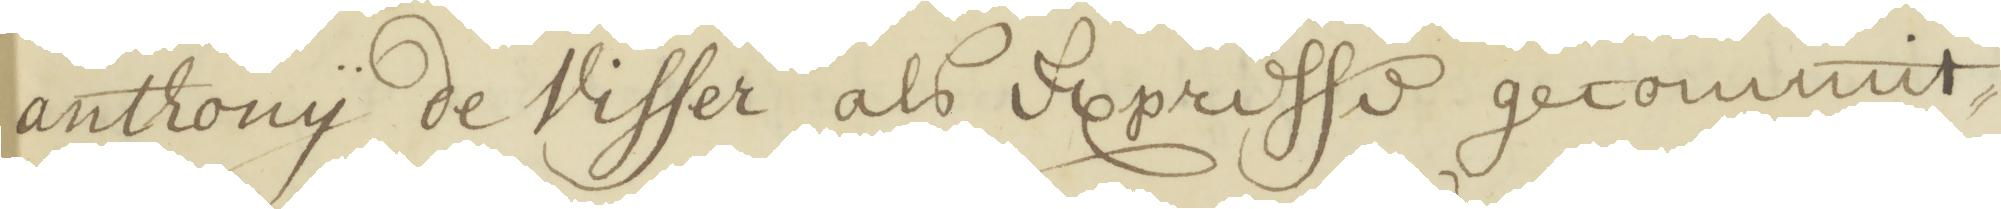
anthonij de Visser als Expresse gecommit„
